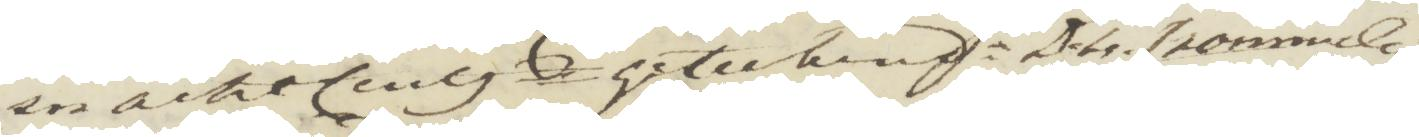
en acht Cent =geteekend= D.F. Crommelin
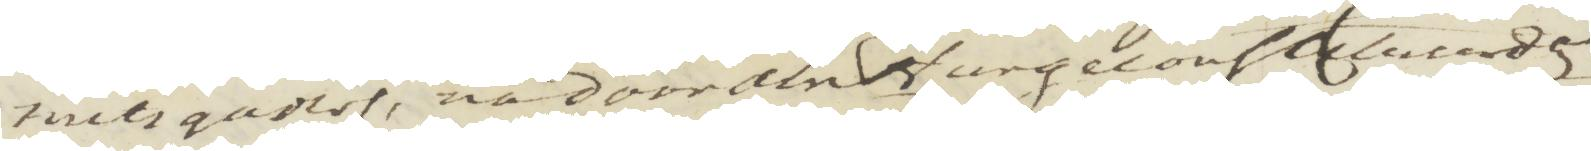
mitsgaders, na door den Heer geconstitueerde
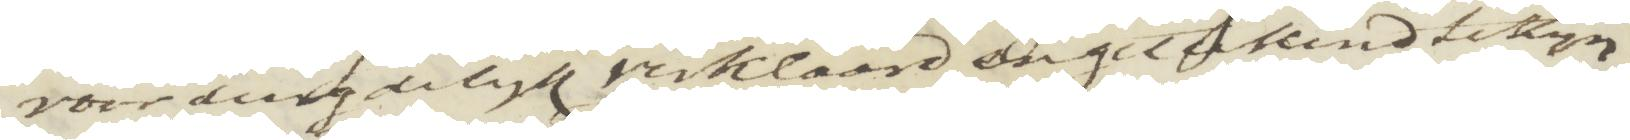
voor deugdelyk verklaard en getekend te zyn
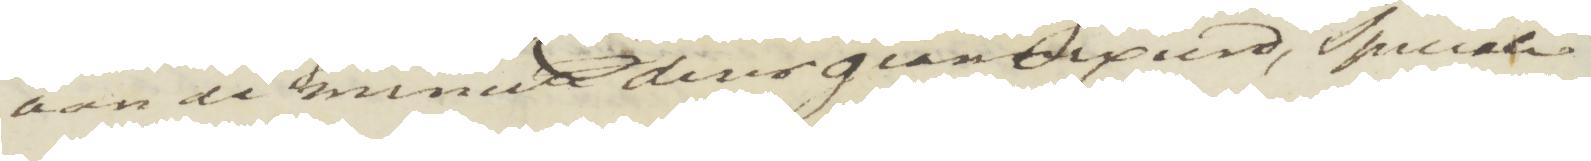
aan de minute dezes geannexeerd, speciale
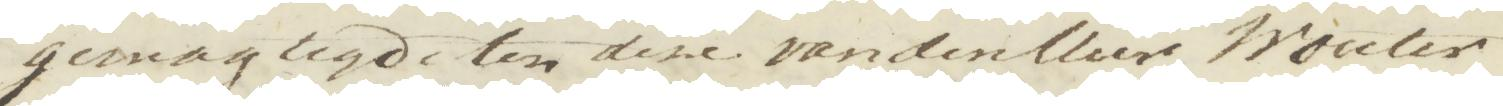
gemagtigde ten deze van den Heer Wouter
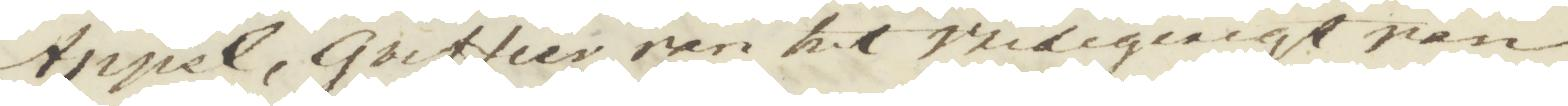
Appel, Griffier van het vredegeregt van
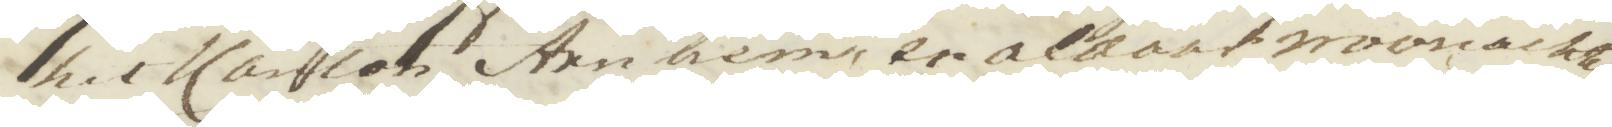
het Kanton Arnhem, en aldaar woonachtig
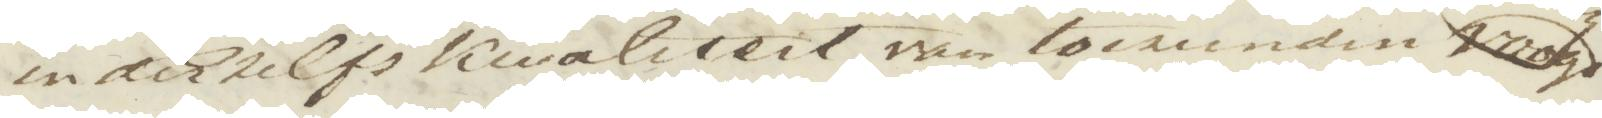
in deszelfs kwaliteit van toezienden voogd
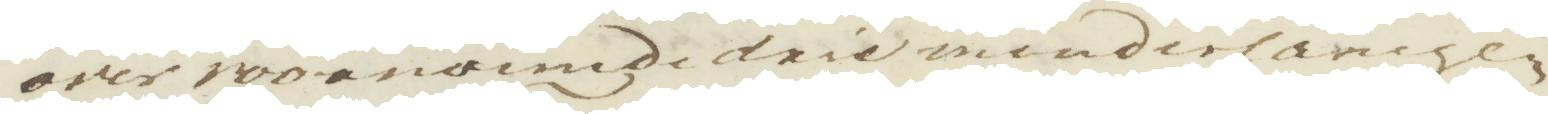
over voornoemde drie minderjarigen
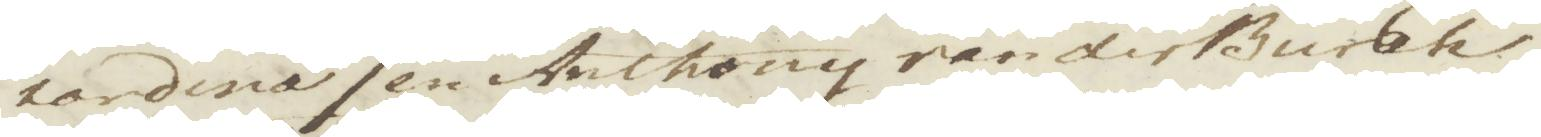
rardina /en Anthony van der Burch,
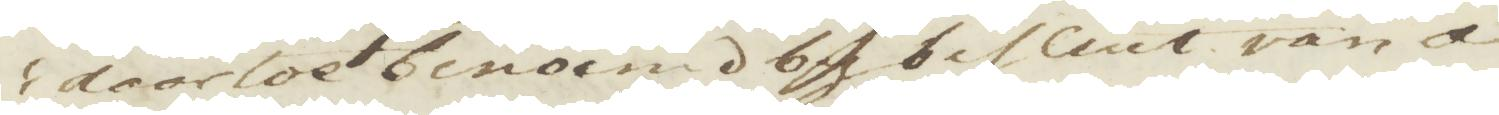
daartoe benoemd by besluit van de
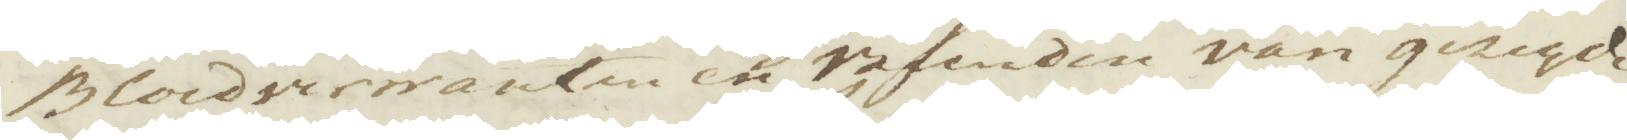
bloedverwanten en vrienden van gezegde
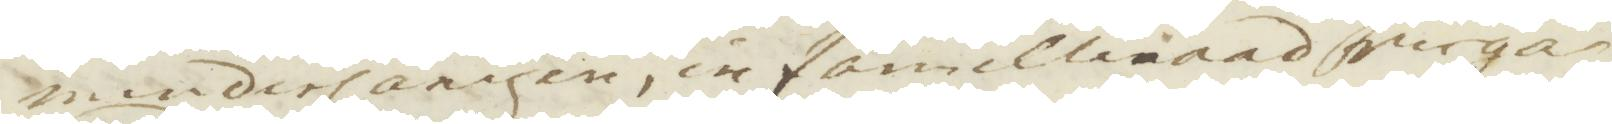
minderjarigen, in familieraad verga
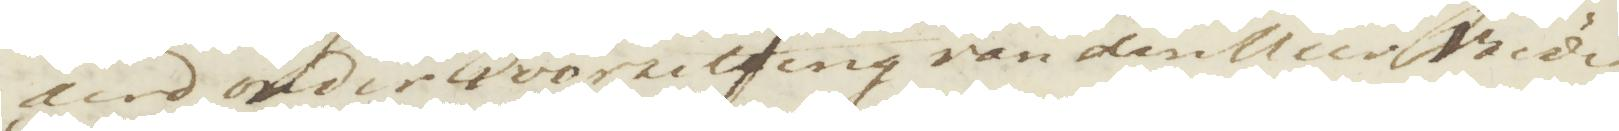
derd onder voorzitting van den Heer Vrede
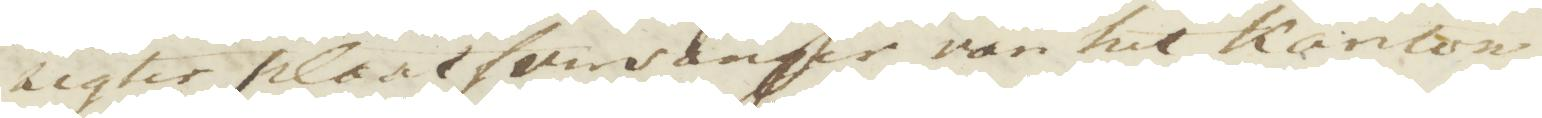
regter plaatsvervanger van het kanton
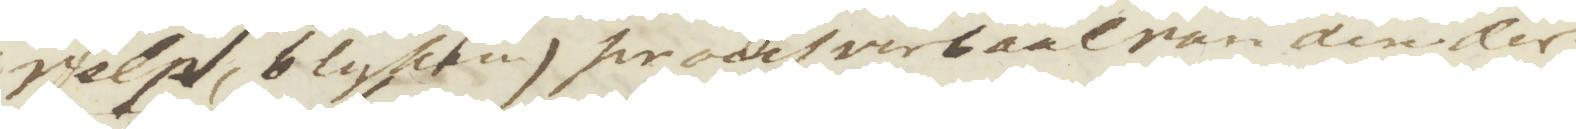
velp, blykens procesverbaal van den der
